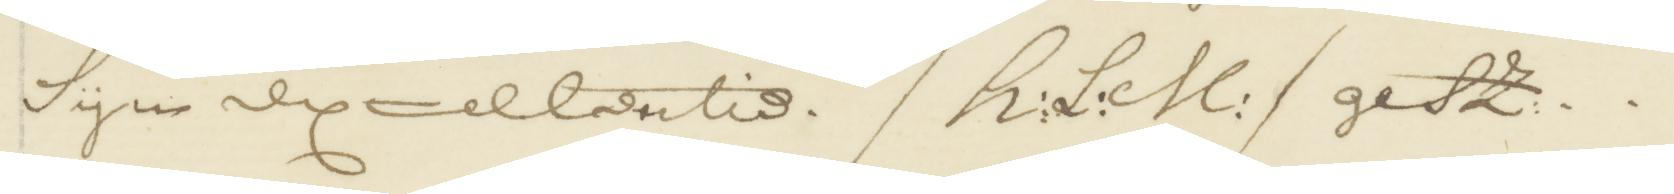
sijn excellentie. / h:L:M: / gesz: . .
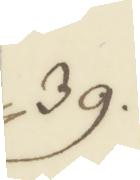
„ 39.
